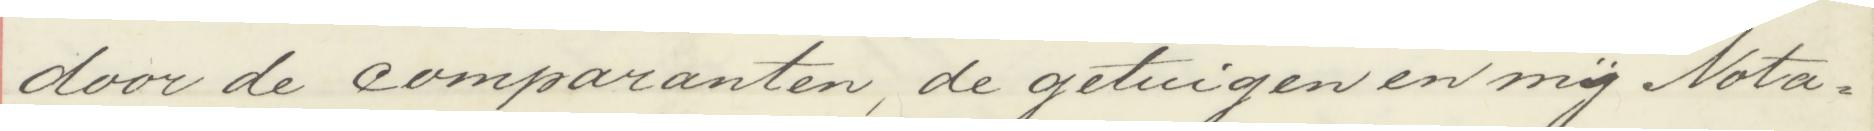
door de comparanten, de getuigen en mij Nota=
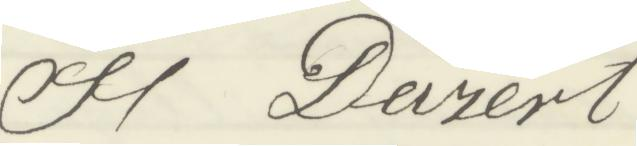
F Dazert
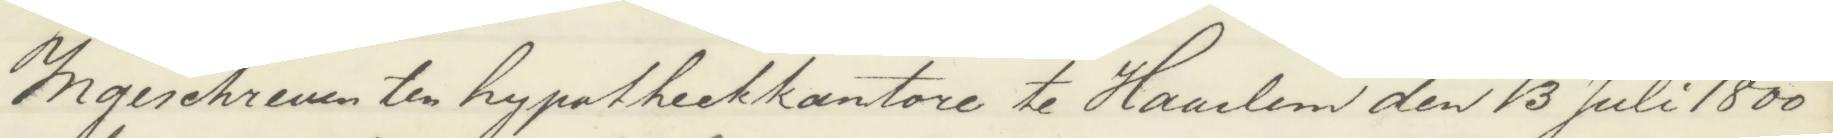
Ingeschreven ten hypotheekkantore te Haarlem den 13 Juli 1800
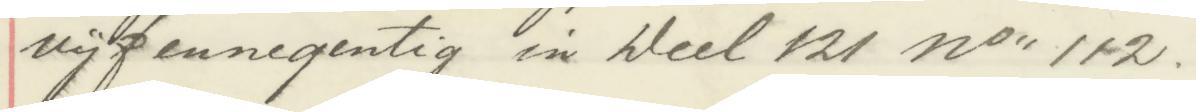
vijf ennegentig in Deel 121 no" 112.
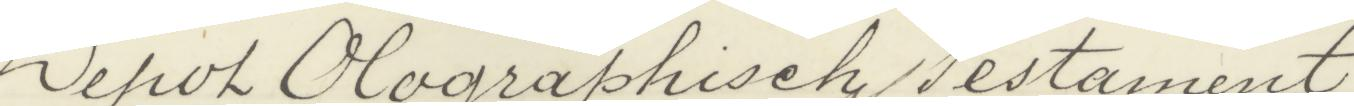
Depot Olographisch Testament
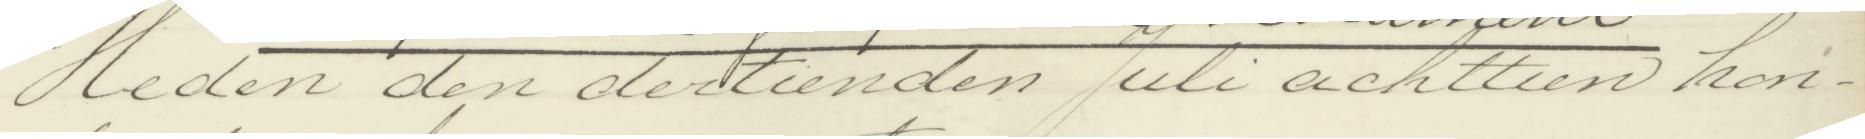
Heden den dertienden Juli achttien hon=
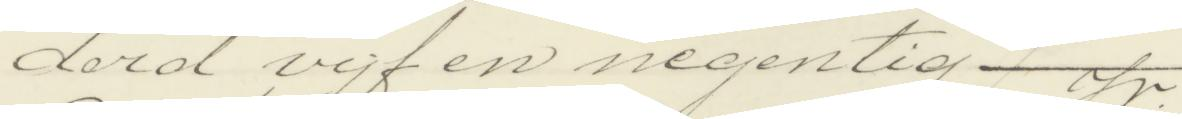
derd vijf en negentig
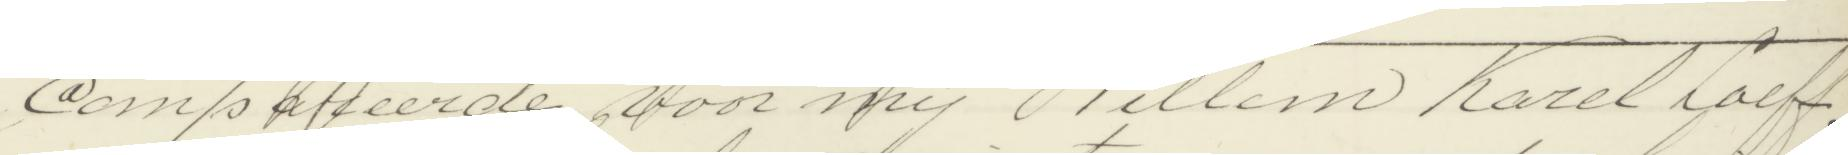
Compareerde voor mij Willem Karel Loeff,
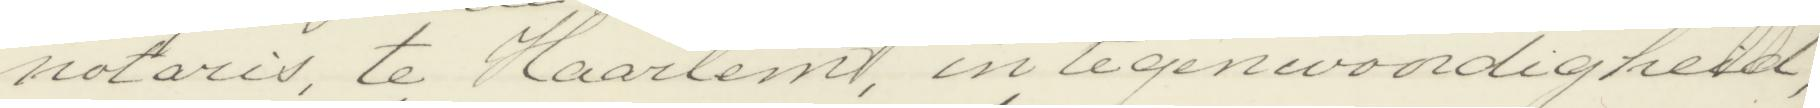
notaris, te Haarlem, in tegenwoordigheid,
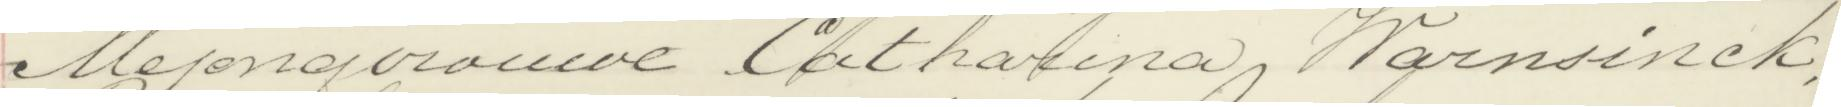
Mejongvrouwe Catharina Warnsinck,
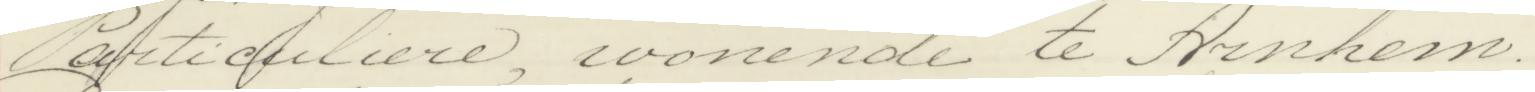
Particuliere, wonende te Arnhem.
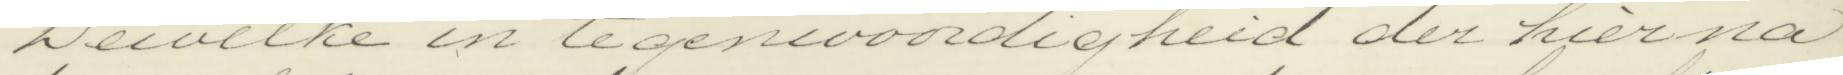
Dewelke in tegenwoordigheid der hier na
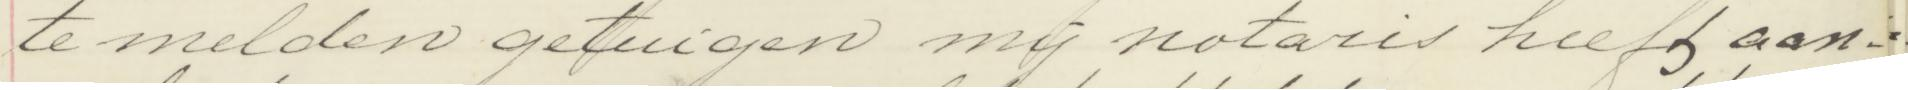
te melden getuigen mij notaris heeft aan-
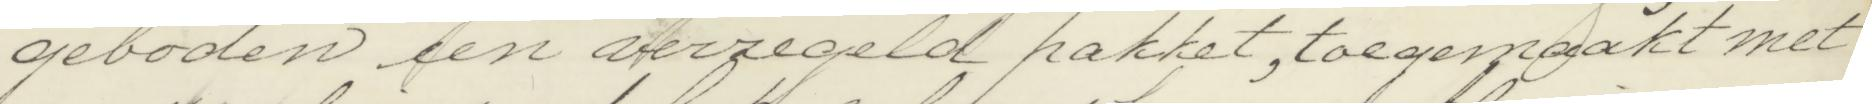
geboden een verzegeld pakket, toegemaakt met
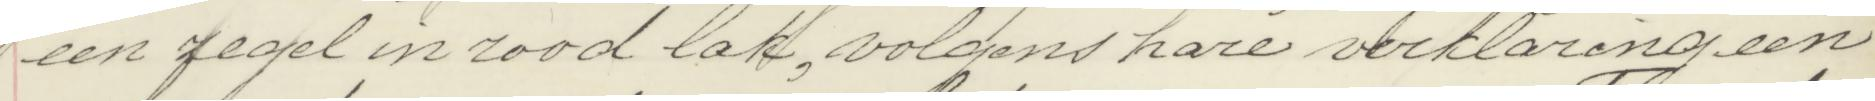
een zegel in rood lak, volgens hare verklaring een
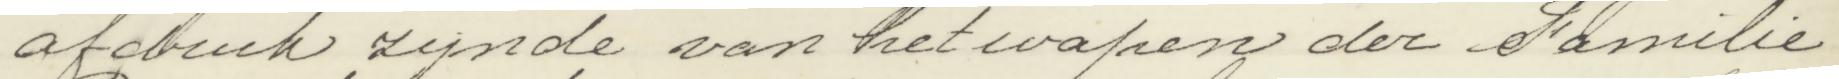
afdruk zijnde van het wapen der Familie
